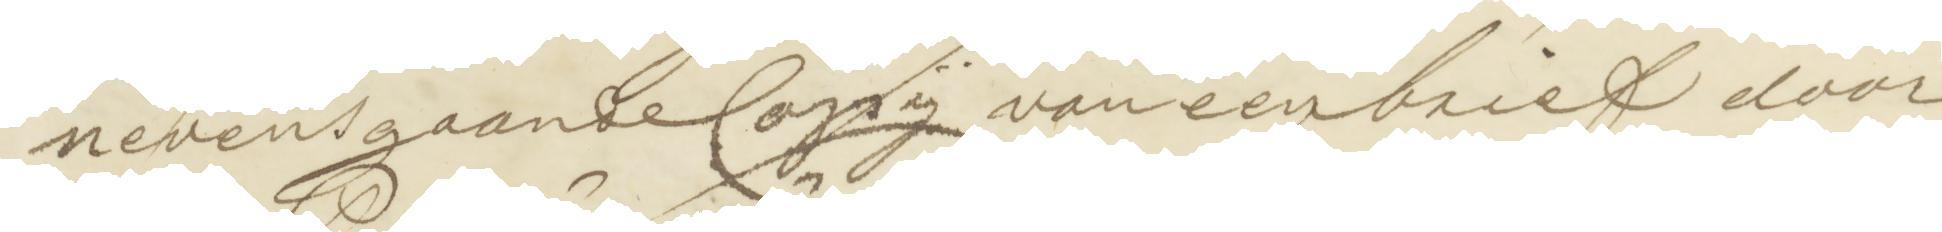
nevens gaande Copij van een brief door
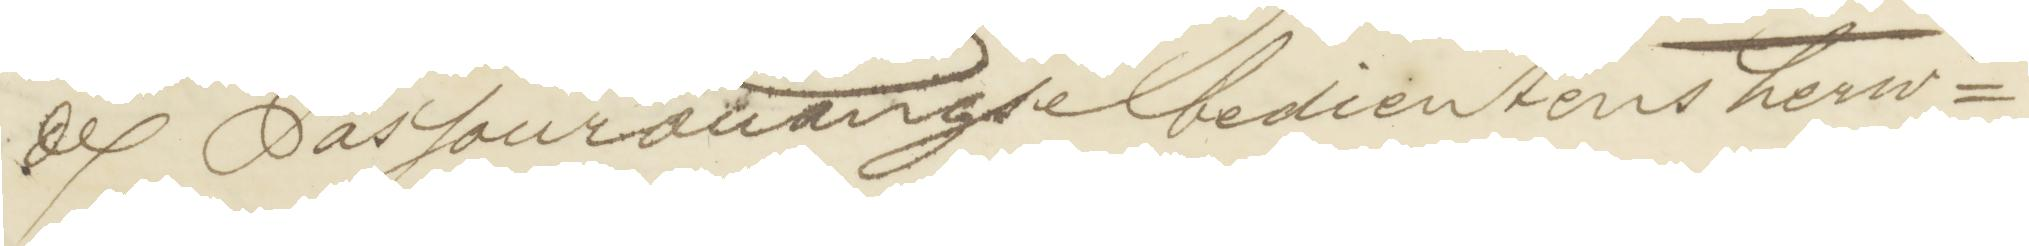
de Passourouangse bedientens herw=ts
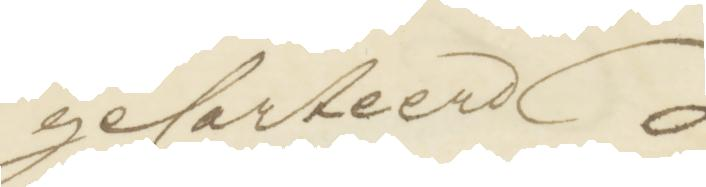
gecarteerd
